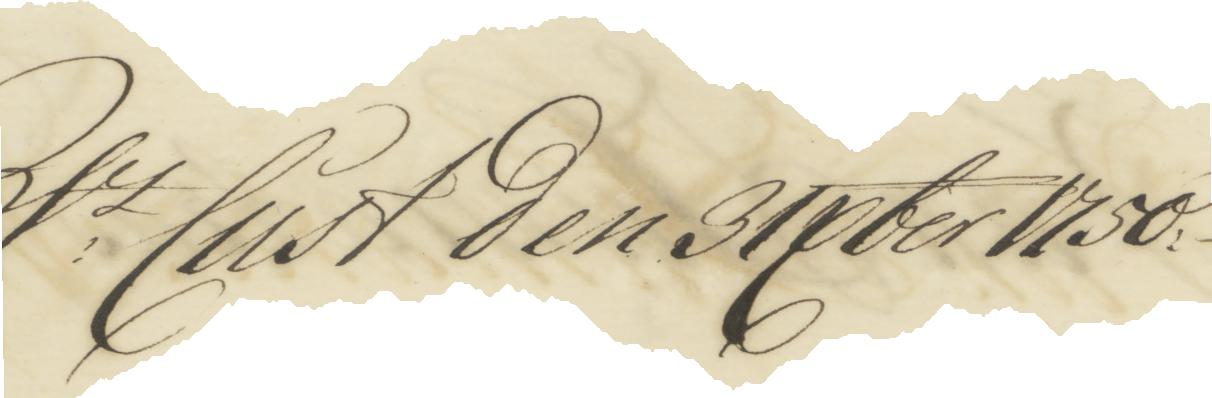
W=t Cust den 31ber 1750:
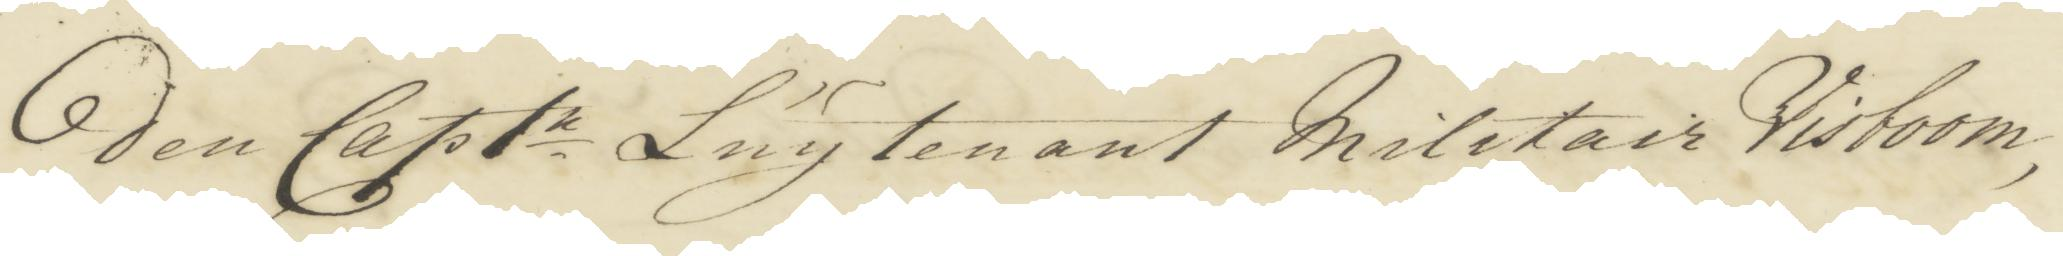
den Capt:n Luijtenant Militair Visboom,
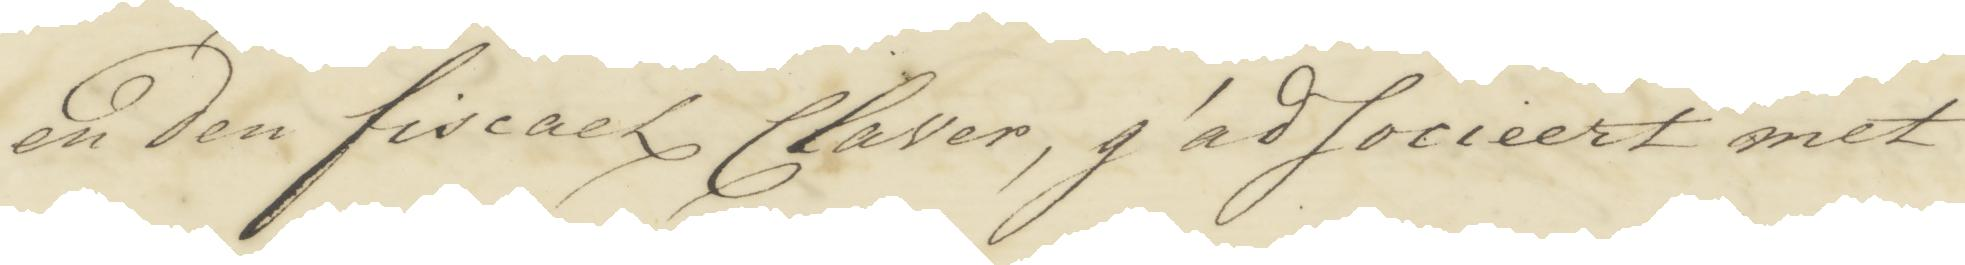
en den fiscael Claver, g’adsocieert met
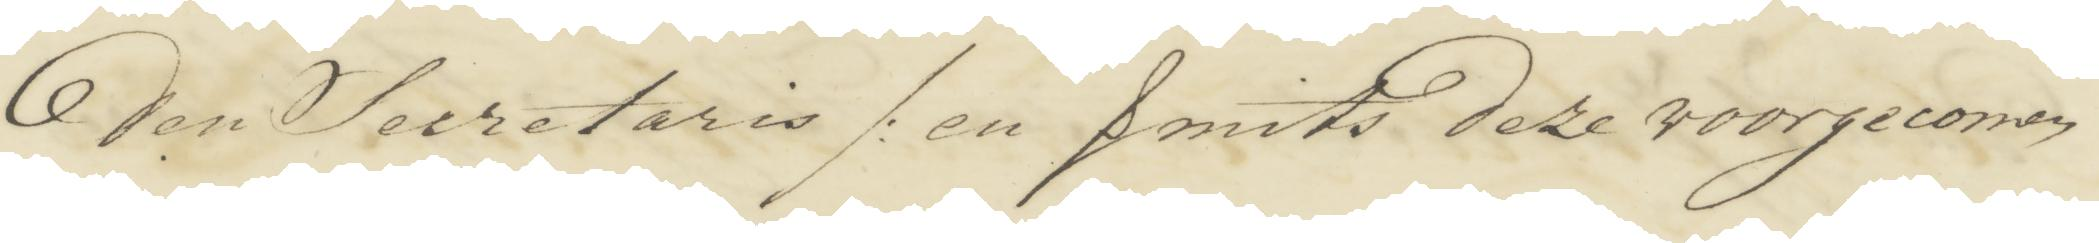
den Secretaris /: en vermits deze voorgecomen
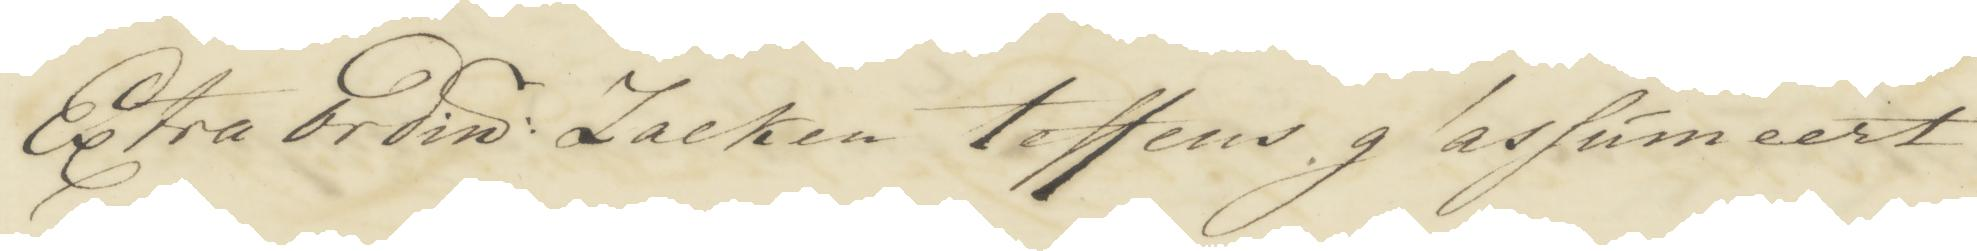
extra ordin: Zaeken teffens g’assumeert
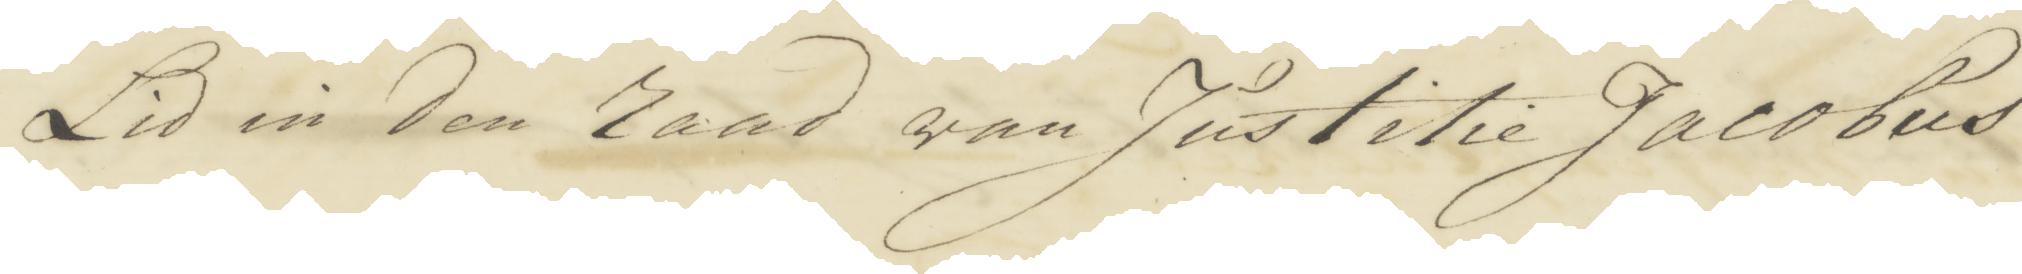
Lid in den raad van Justitie Jacobus
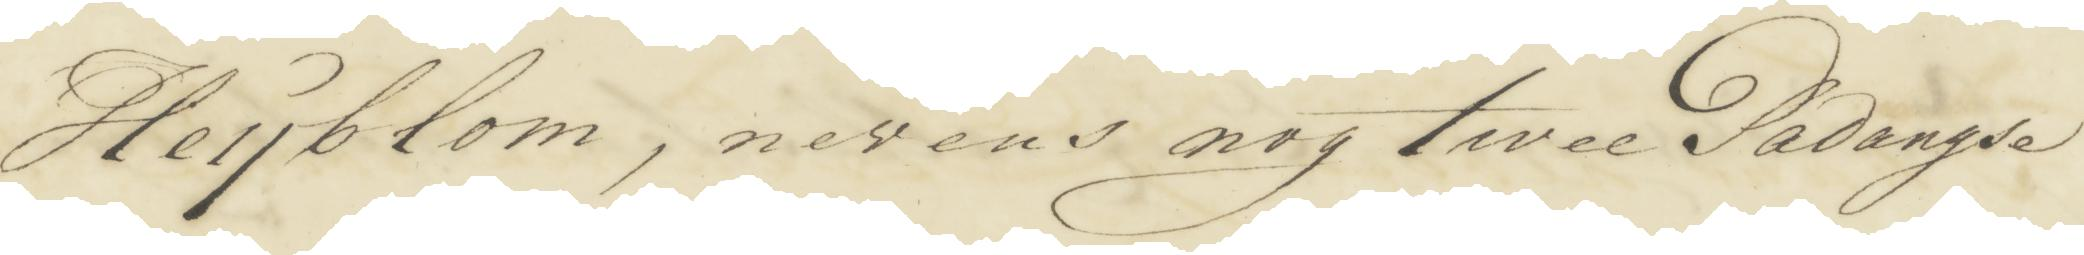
Heijblom, nevens nog twee Padangse
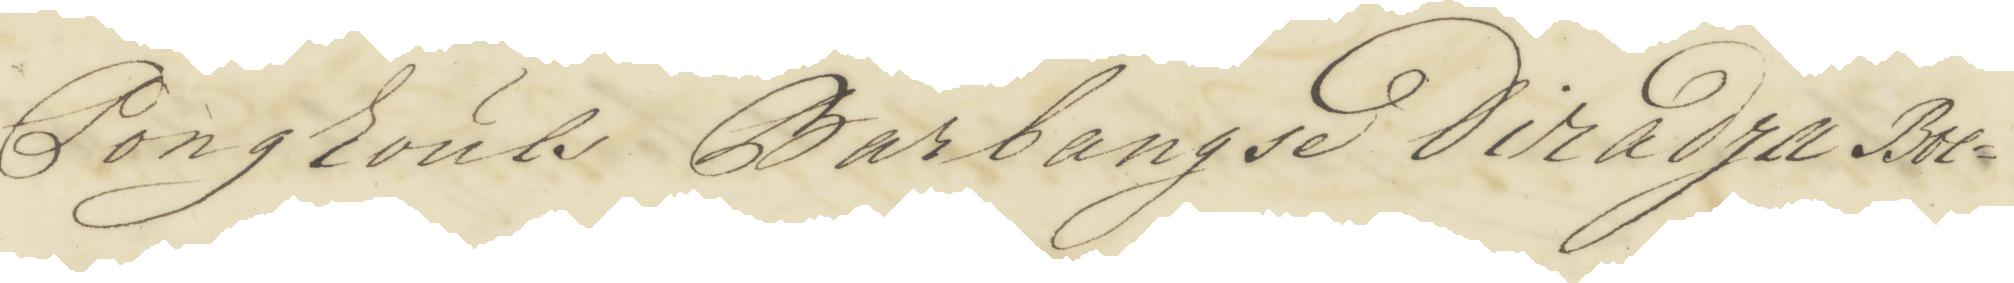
Ponghouls Barbangse Diradja Boe=
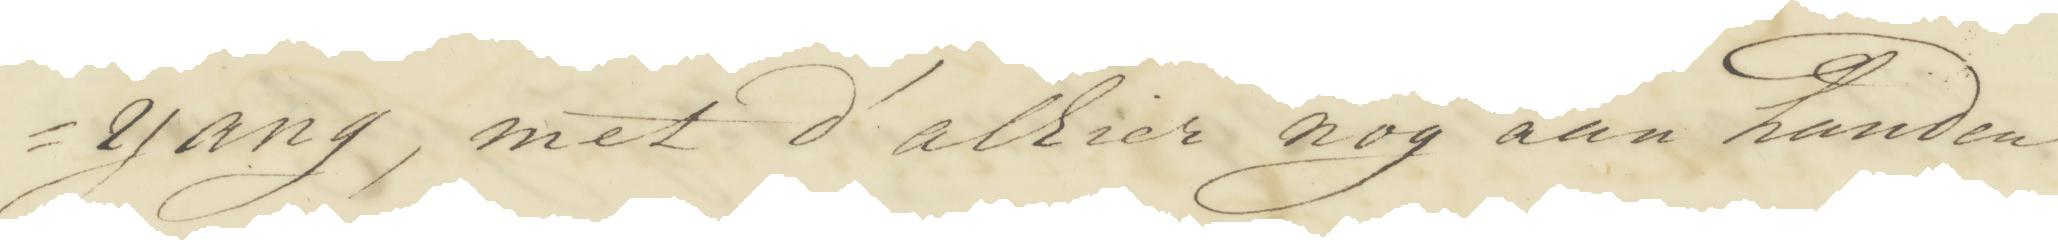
=yang met d’ alhier nog aan handen
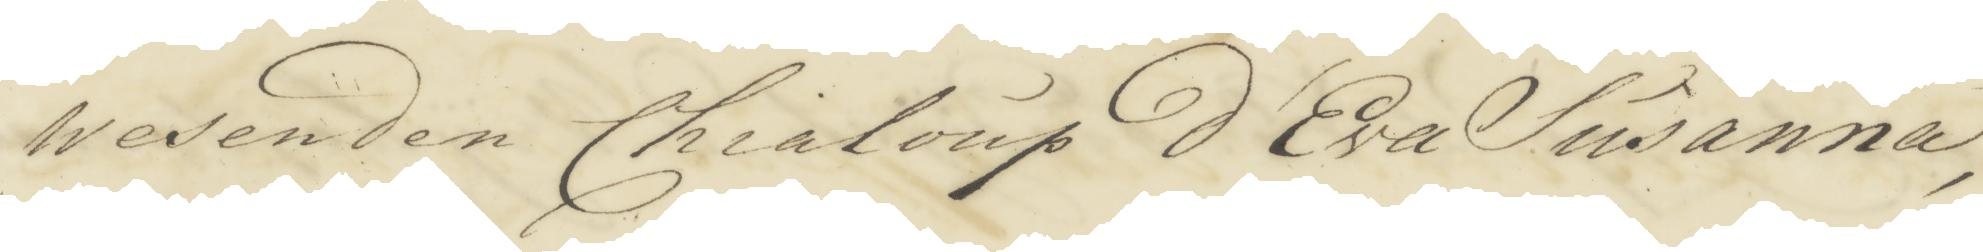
wesenden chialoup d’ Eva Susanna,
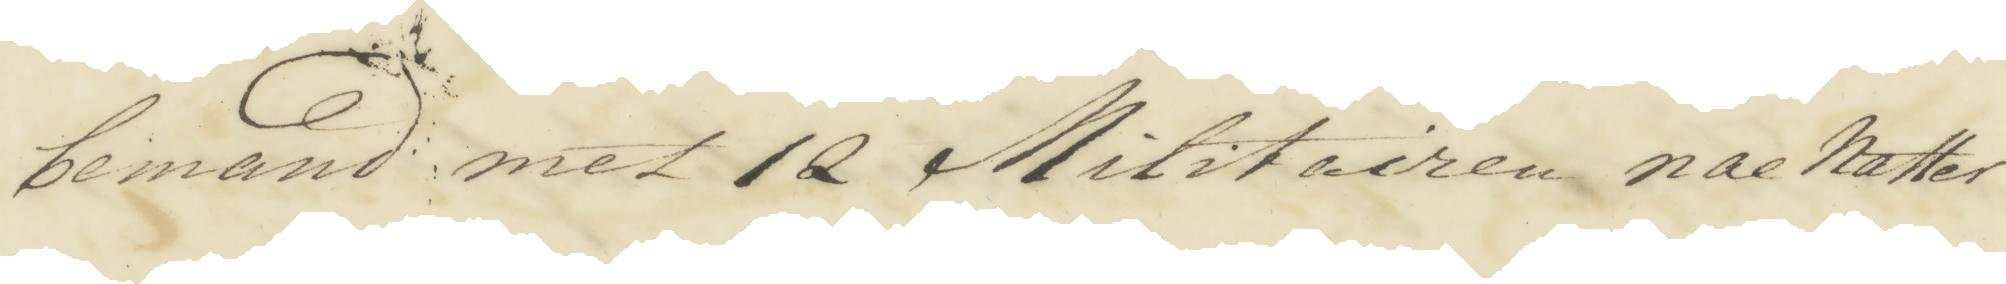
bemand met 12 Militairen nae Natter
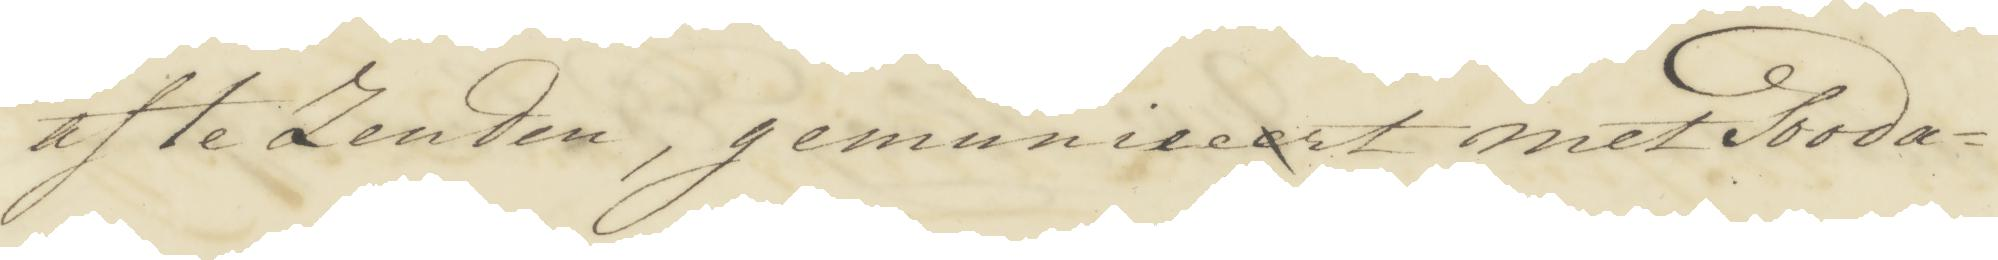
af te Zenden, gemuniceert met Sooda=
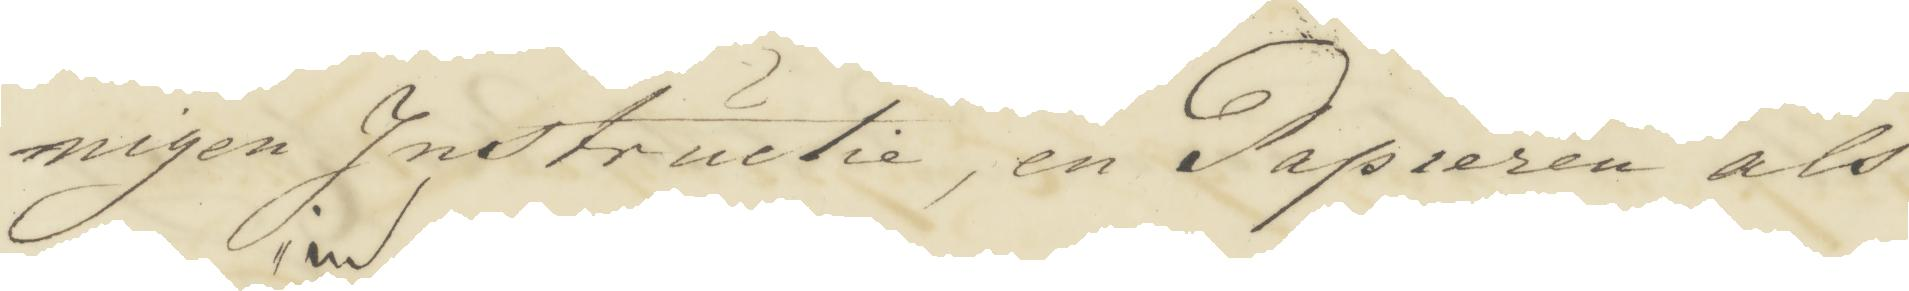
nigen Jnstructie, en Papieren als
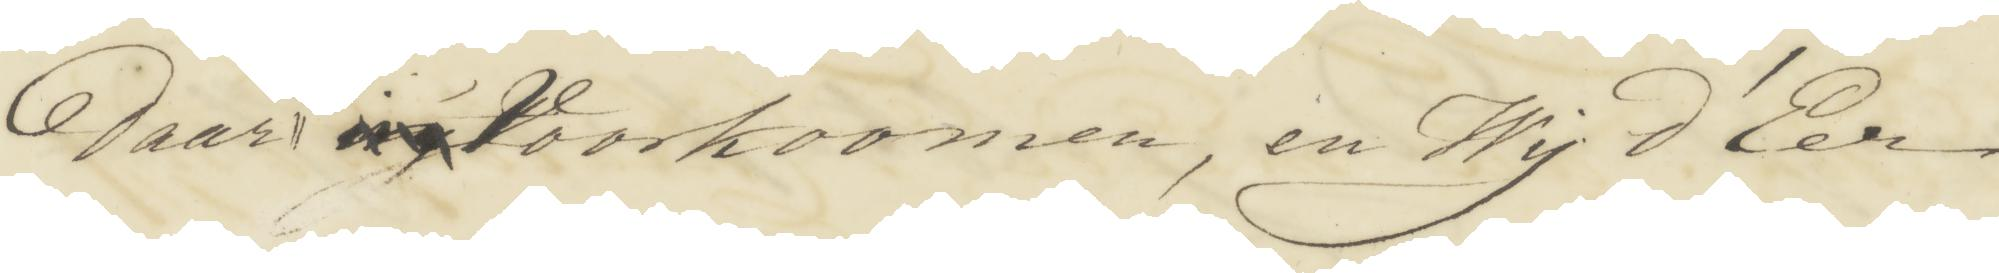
daar" Voorkoomen, en Wij d’ Eer
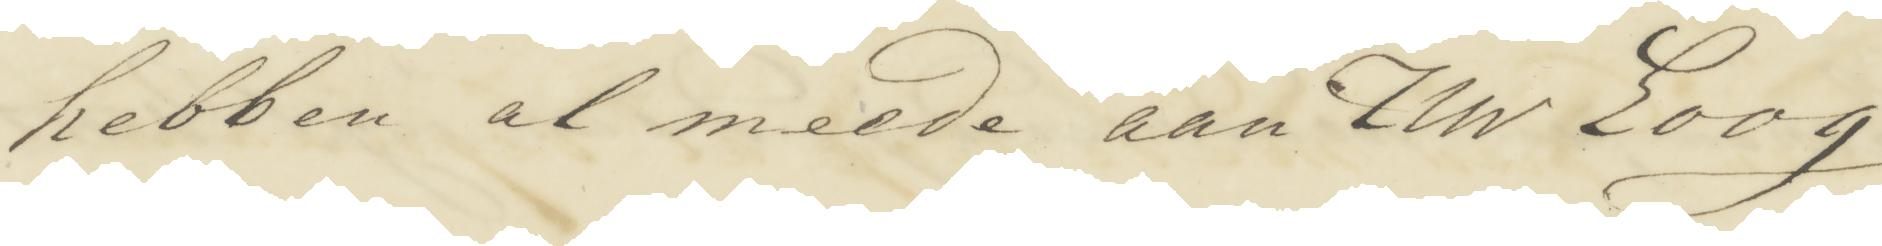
hebben al meede aan Uw hoog
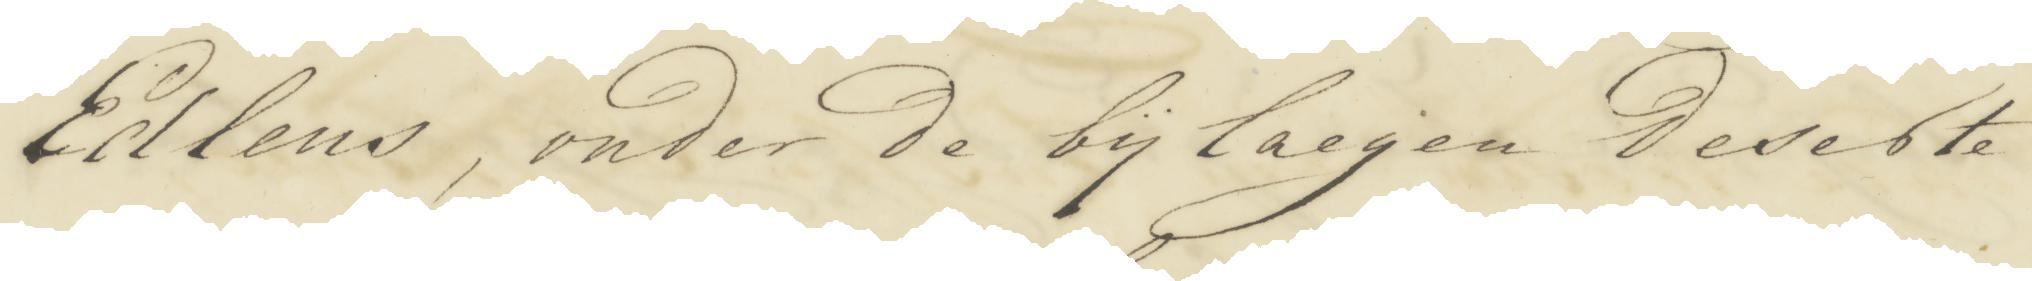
Edlens, onder de bijlaegen deses te
